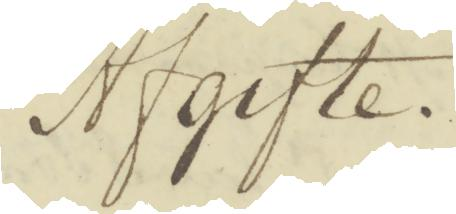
Afgifte.
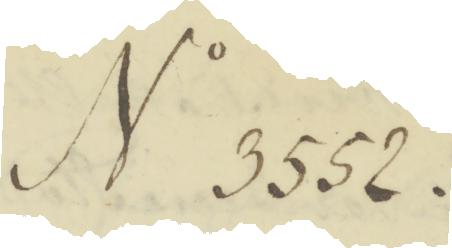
No 3552.
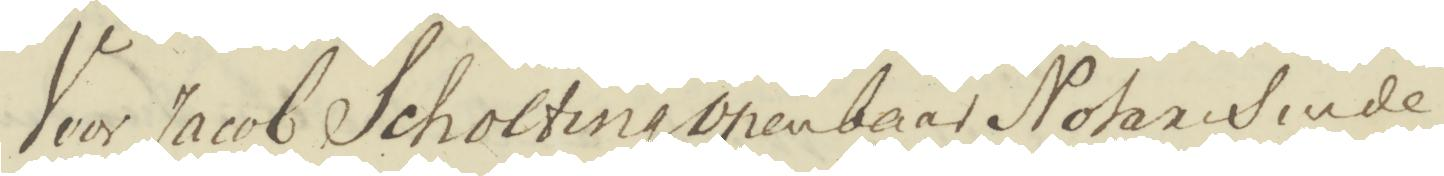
Voor Jacob Scholting openbaar Notaris inde
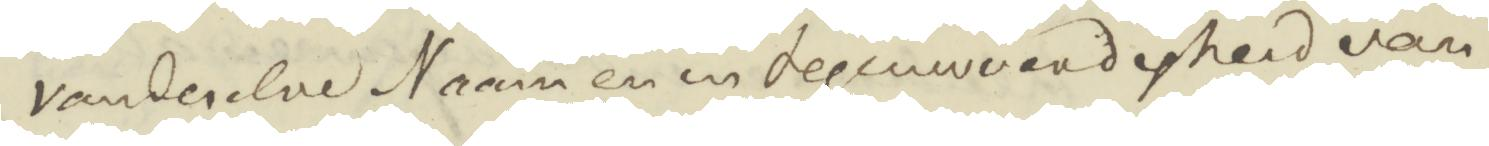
vandeselve Naam en in tegenwoordigheid van
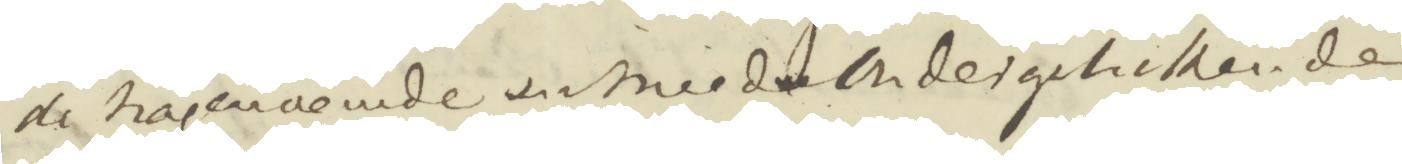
de nagenoemde en meede ondergeteekende
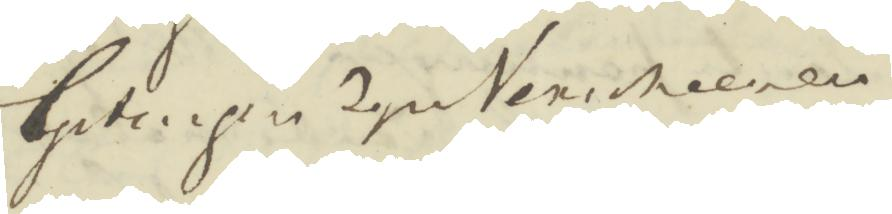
Getuigen zijn Verscheenen
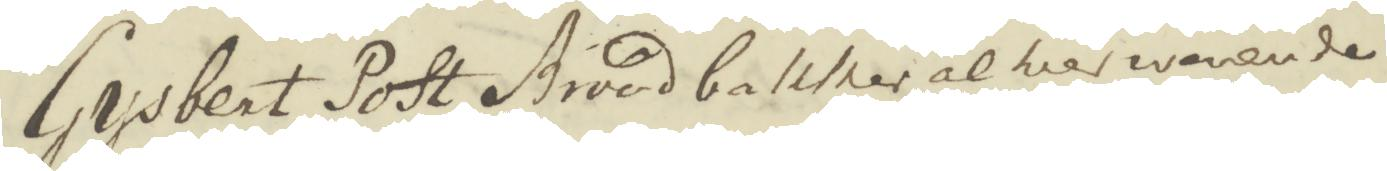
Gijsbert Post Broodbakker alhier wonende
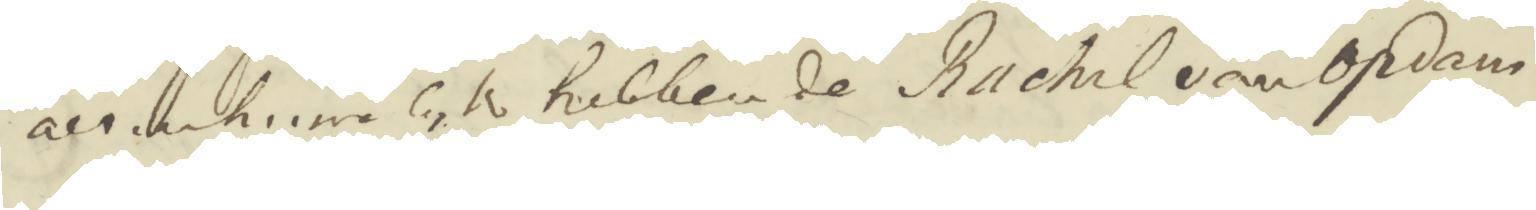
als in huwe lijk hebbende Rachel van opdam
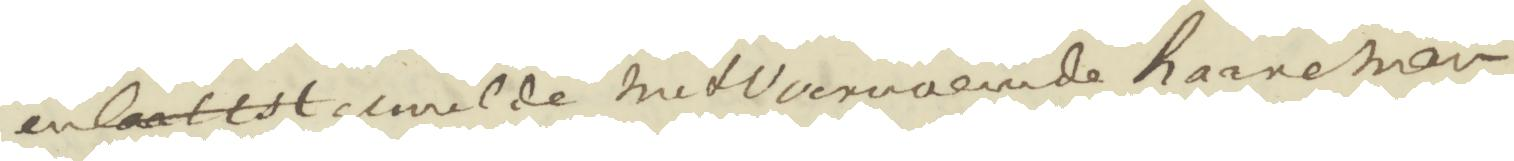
en laattst gemelde met voornoemde haare man
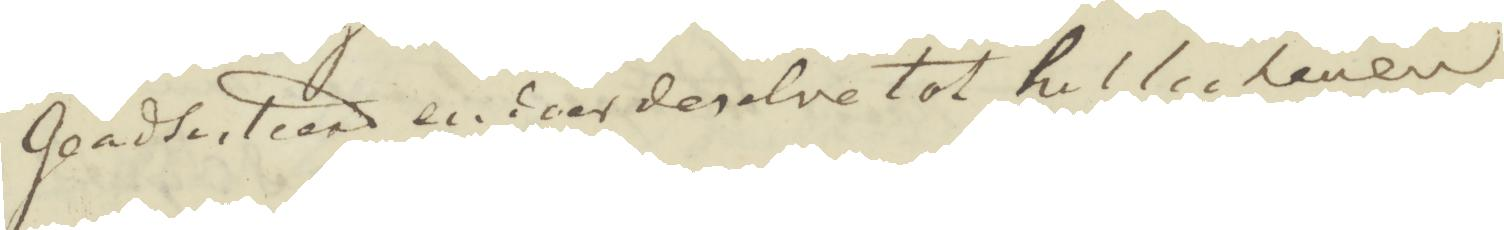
geadsisteerd en door deselve tot het teekenen
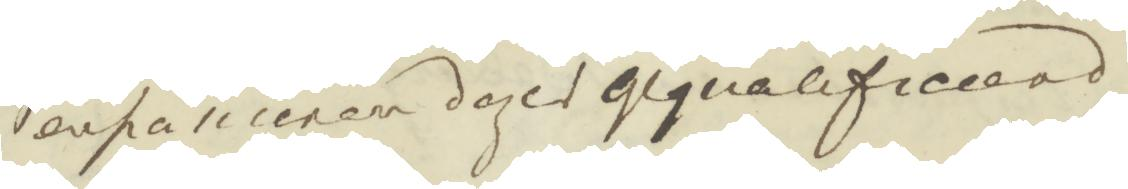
en passeeren dezes gequalificeerd
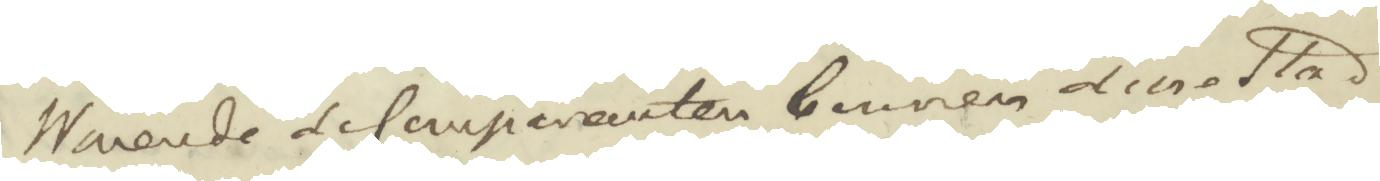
Wonende de Comparanten binnen deese stad
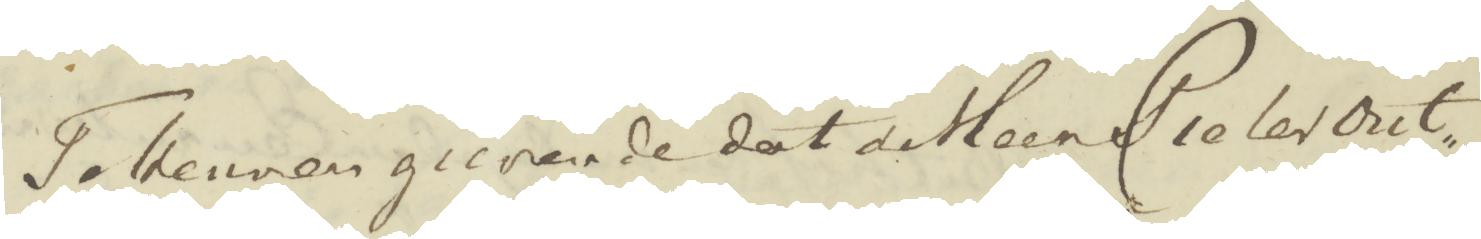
Te kennen geevende dat de Heer Pieler out„
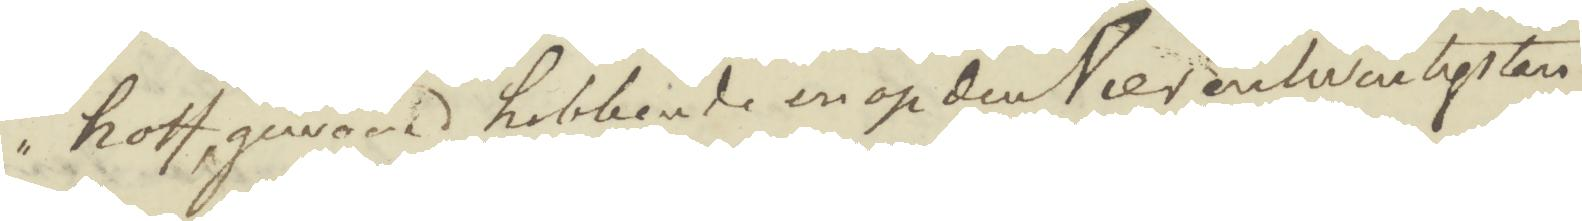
hoff, gewoond hebbende en op den Vierentwintigsten
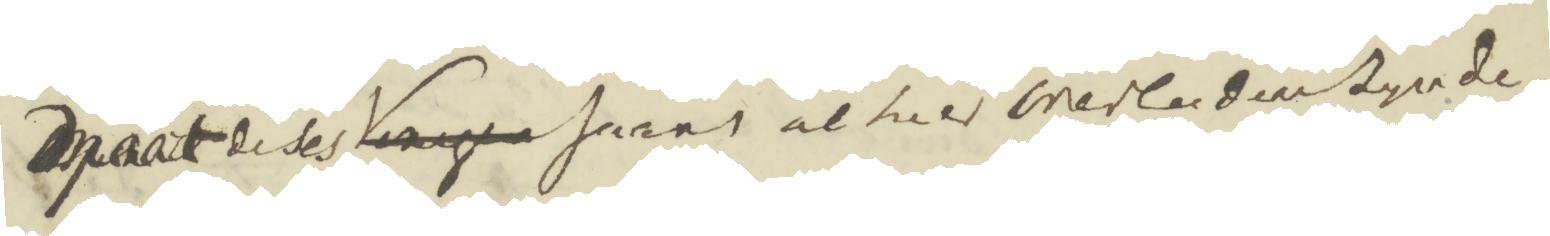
maart de ses Kregen Jaars alhier overleden zijnde,
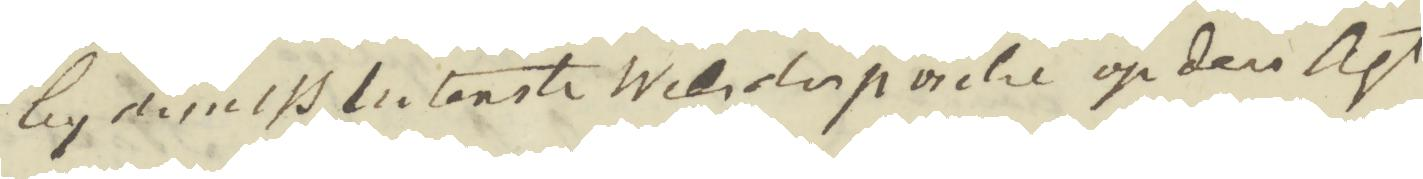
by desselfs Uiterste Wilsdispositie op den Agt
